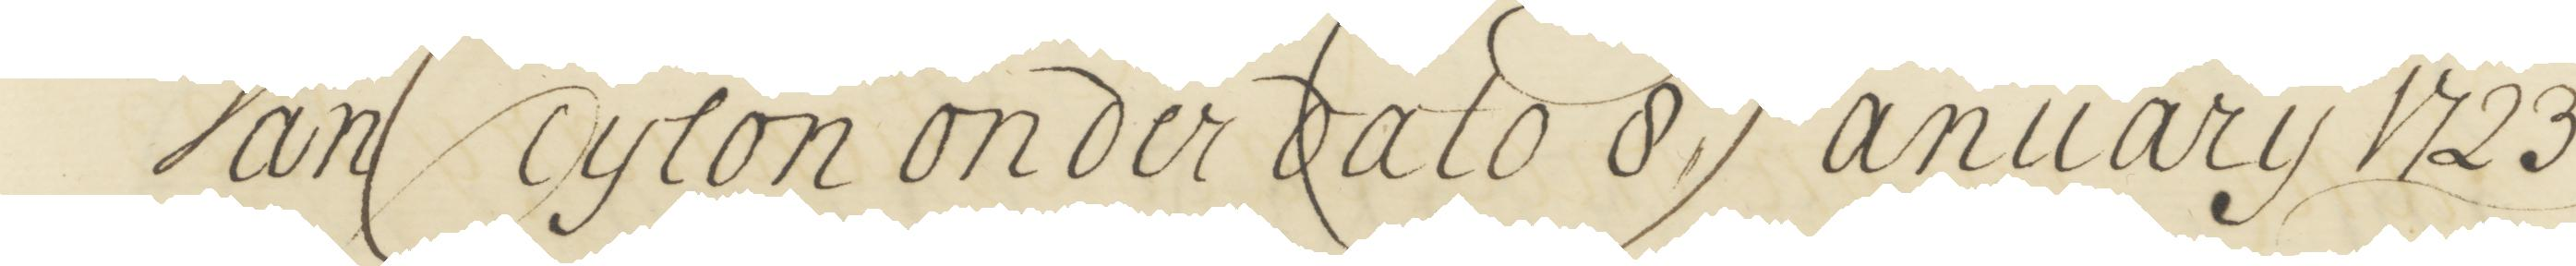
Van Ceylon onder dato 8„' Januarij 1723
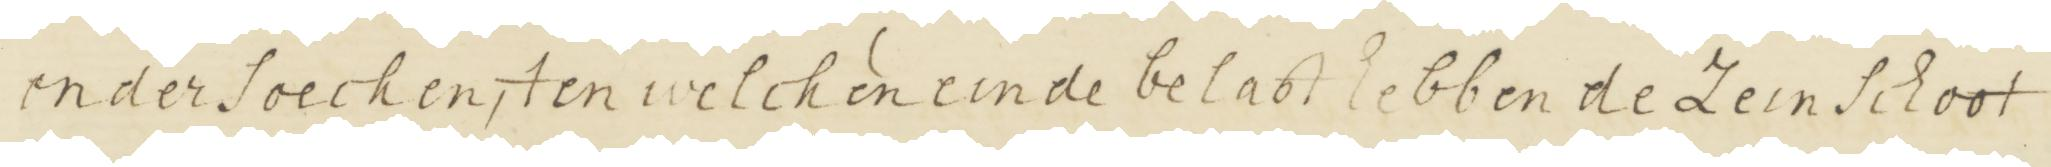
ondersoecken, ten welcken einde belast hebben de zeinschoot
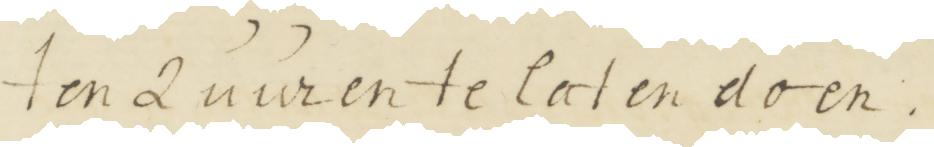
ten 2 uuren te laten doen.
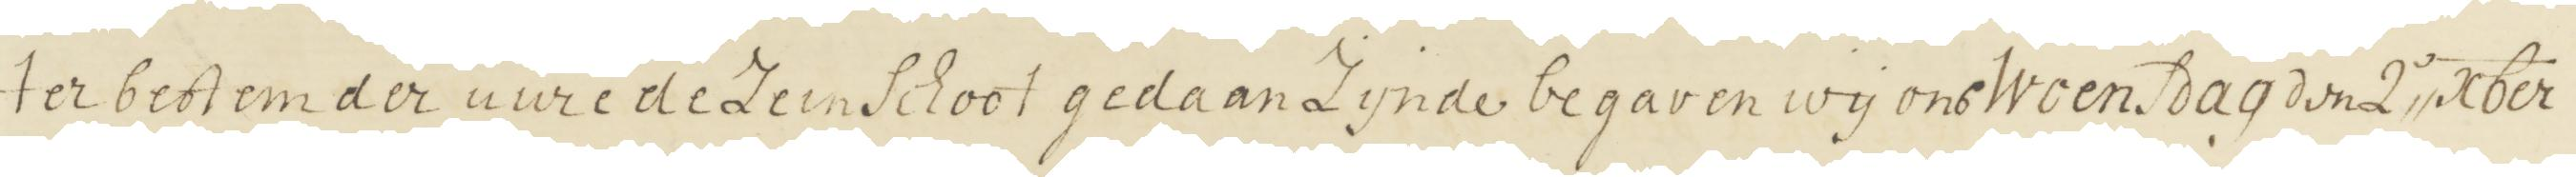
ter bestemder uure de zeinschoot gedaan zijnde begaven wij ons woensdag den 2„' xber
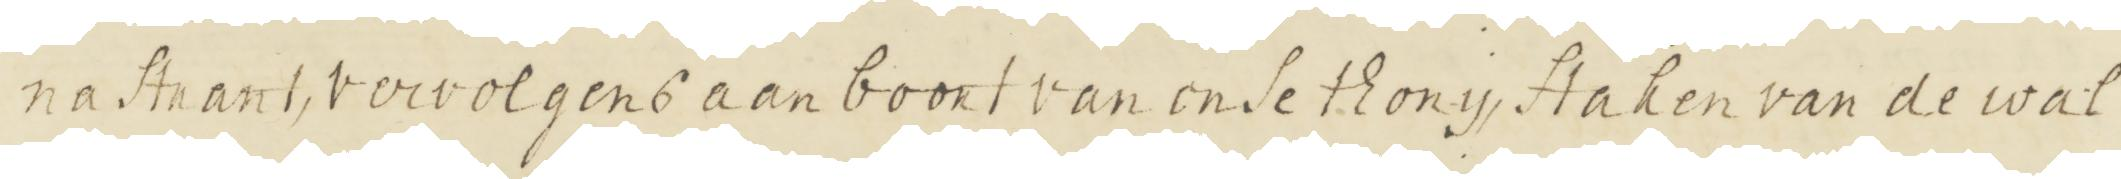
na strant, vervolgens aan boort van onse thonij, staken van de wal
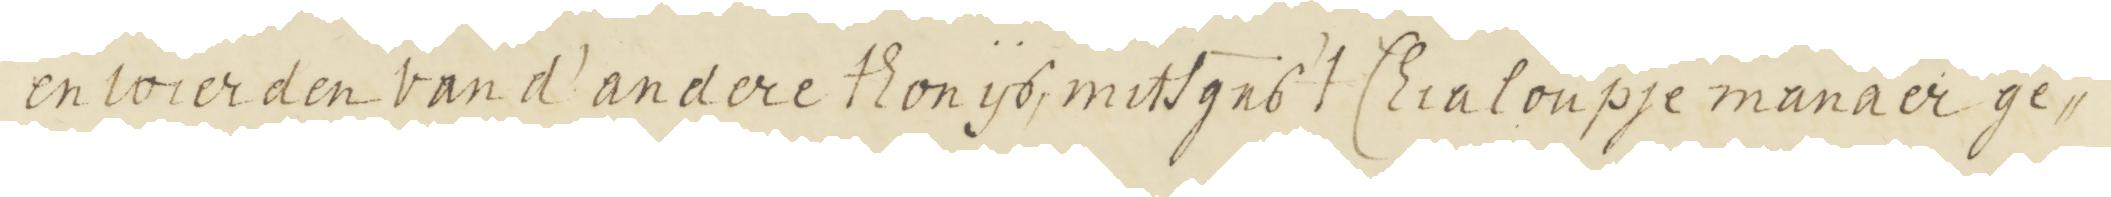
en wierden van d’ andere thonijs, mitsgrs ’t Chialoupje manaer ge„
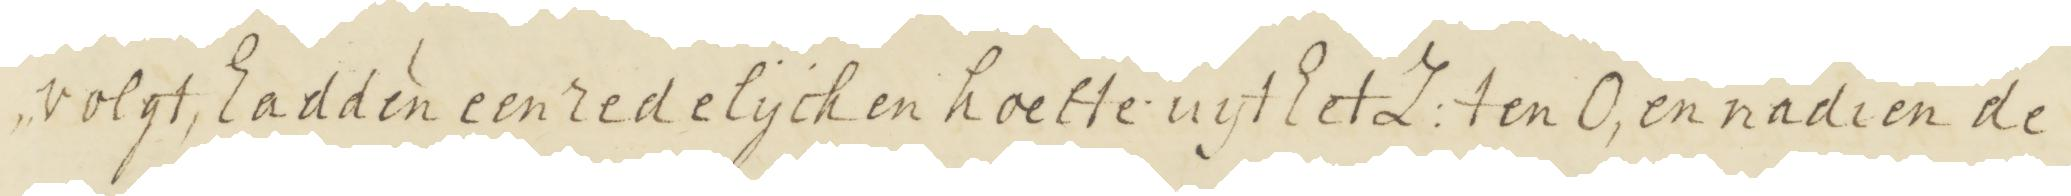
„volgt, hadden een redelijcken koelte uyt het Z: ten O, en nadien de
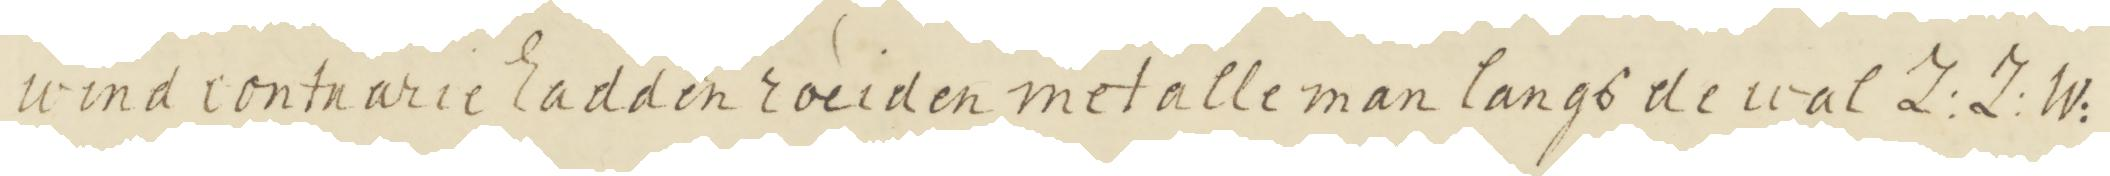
wind contrarie hadden roeiden met alle man langs de wal Z: Z: W:
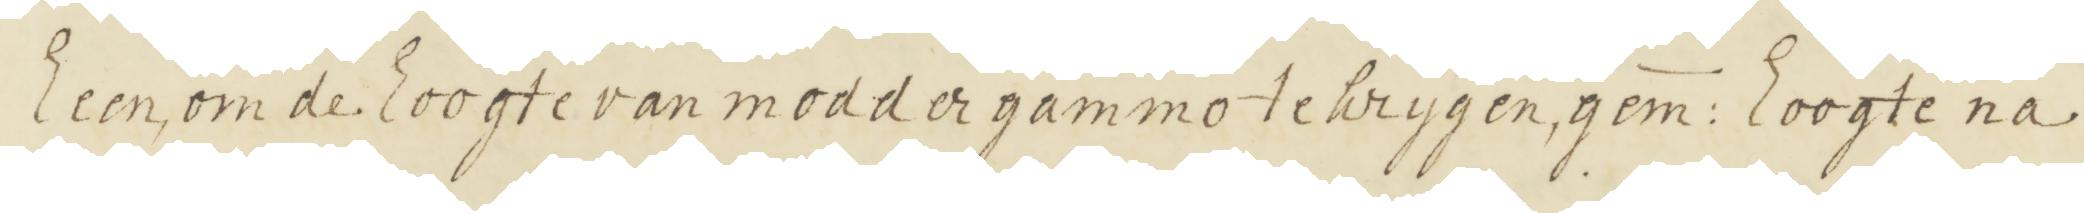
heen, om de hoogte van moddergammo te krijgen, gem: hoogte na
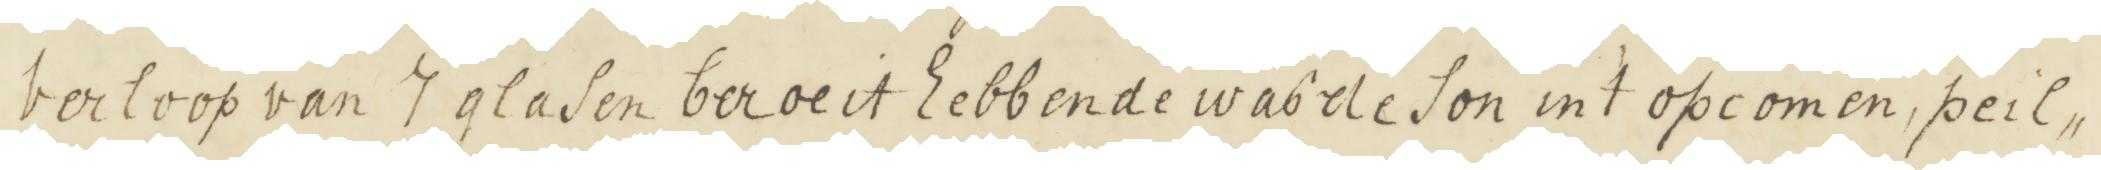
verloop van 7 glasen beroeit hebbende was de son in ’t opcomen, peil„
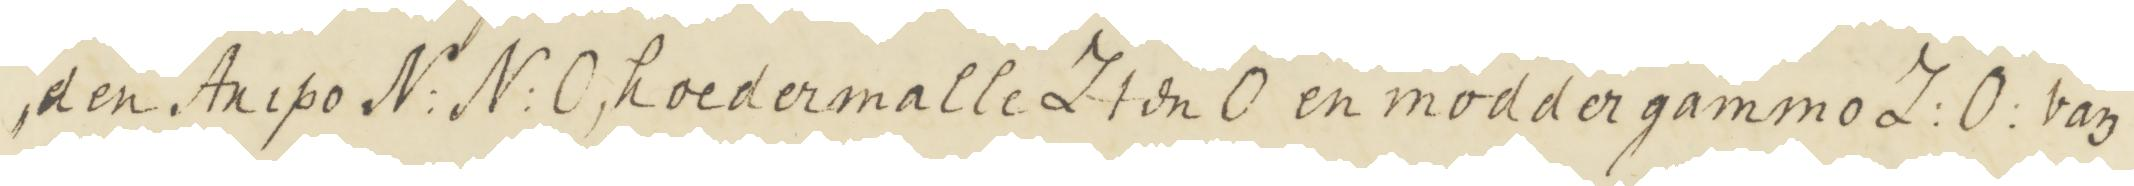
„den Aripo N: N: O, hoedermalle Z ten O en moddergammo Z: O: van
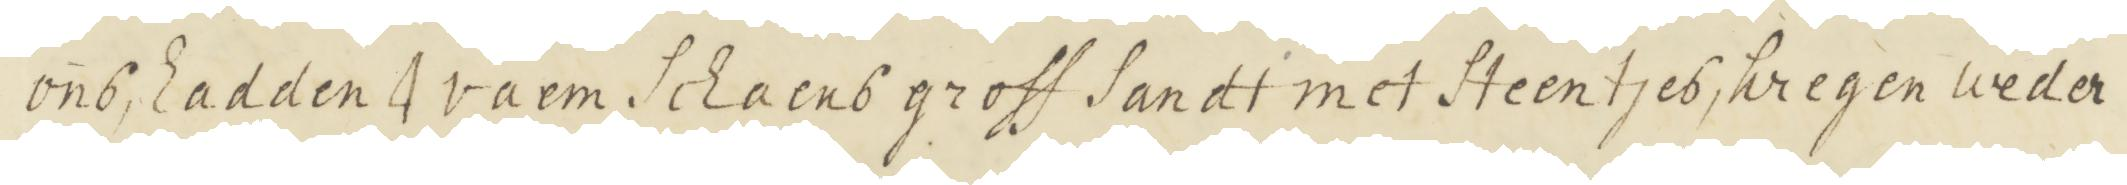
ons, hadden 4 vaem schaers groff sandt met steentjes, kregen weder
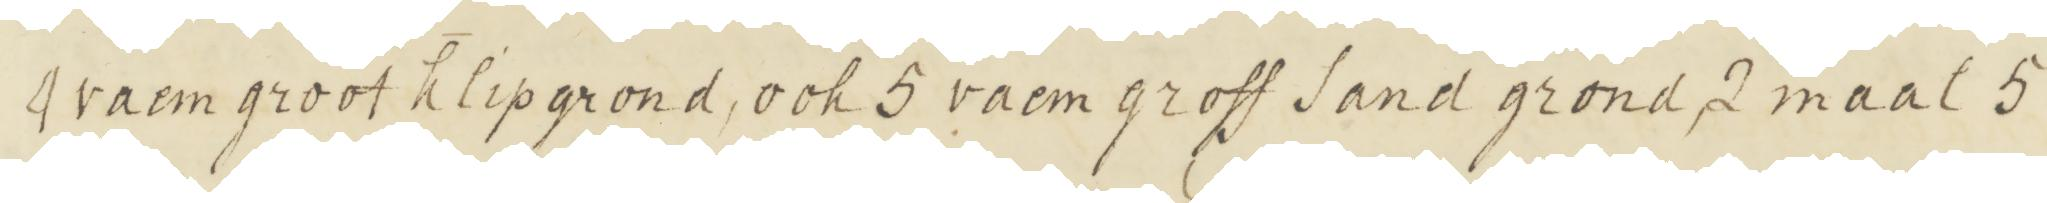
4 vaem groot klipgrond, ook 5 vaem groff sand grond, 2 maal 5
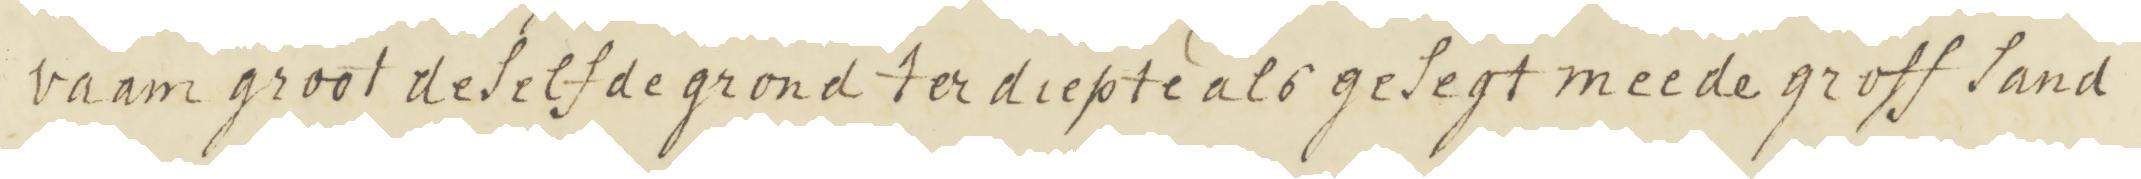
vaam groot deselfde grond ter diepte als gesegt meede groff sand
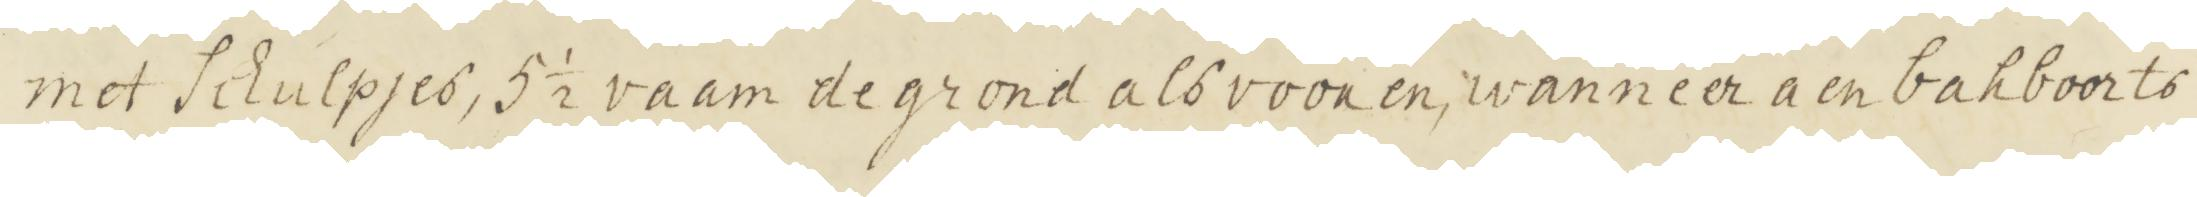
met schulpjes, 5½ vaam de grond als vooren, wanneer aen bakboorts
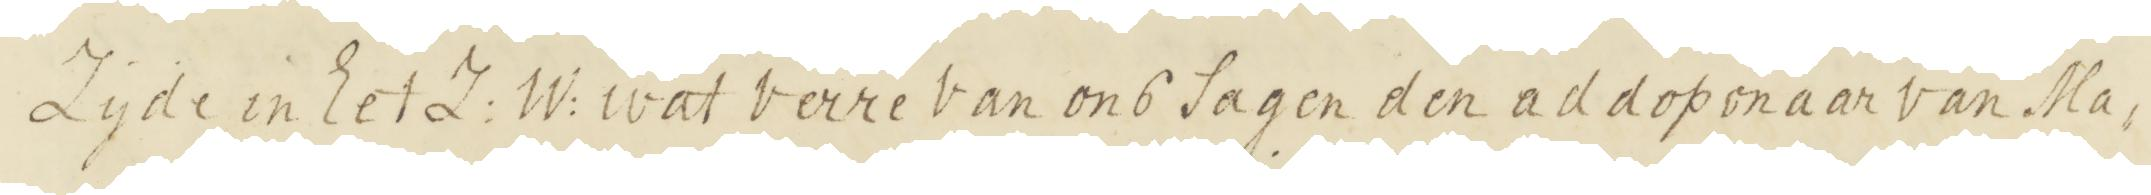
Zijde in het Z: W: wat verre van ons sagen den addoponaar van Ma„
